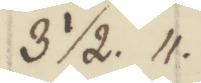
3½. „.
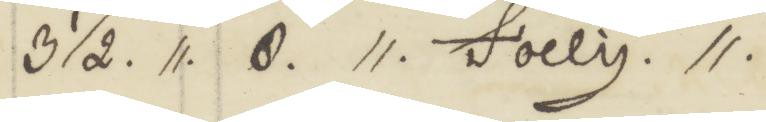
3½. „. 8. „. foelij. „.
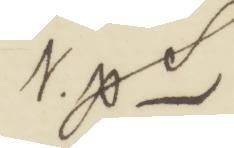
1. p-s
